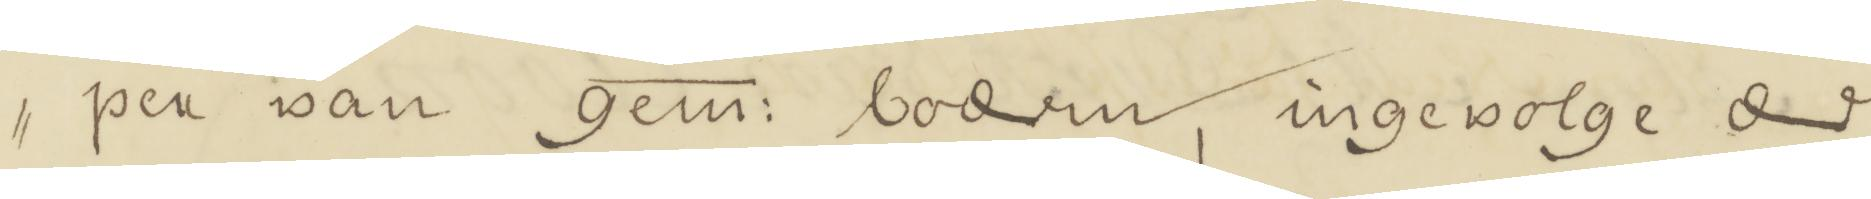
„per van gem: bodem, ingevolge de
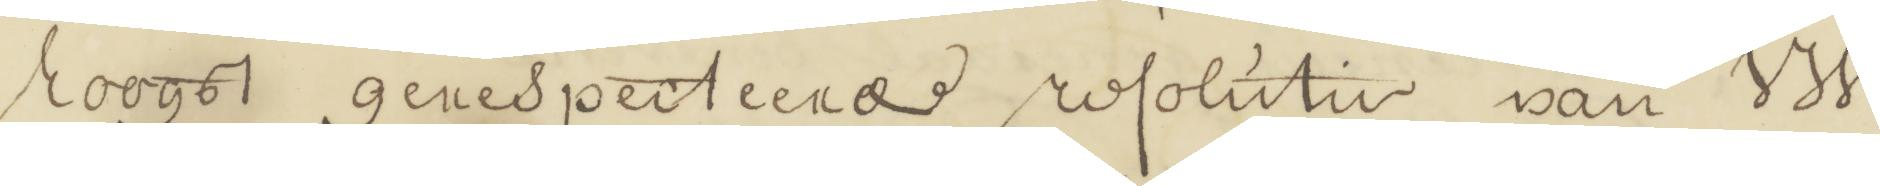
hoogst gerespecteerde resolutie van VW
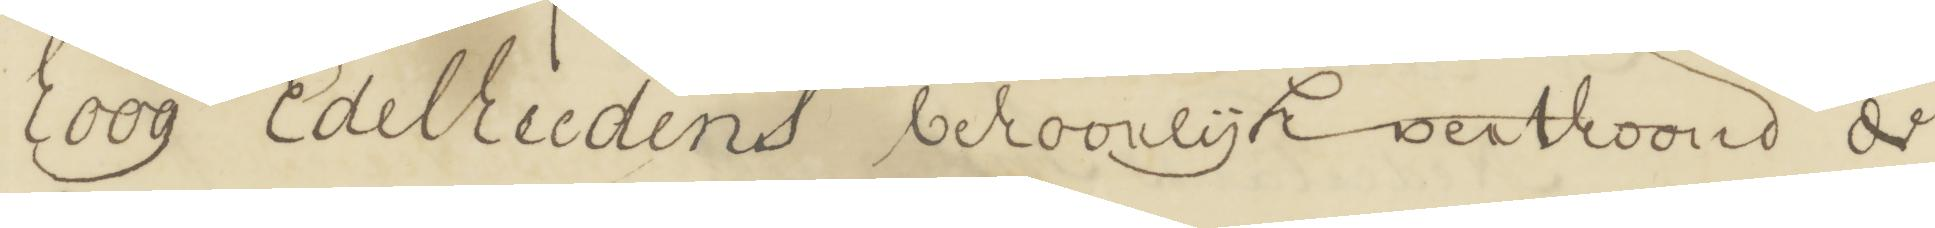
hoog Edelheedens behoorlijk verthoond de
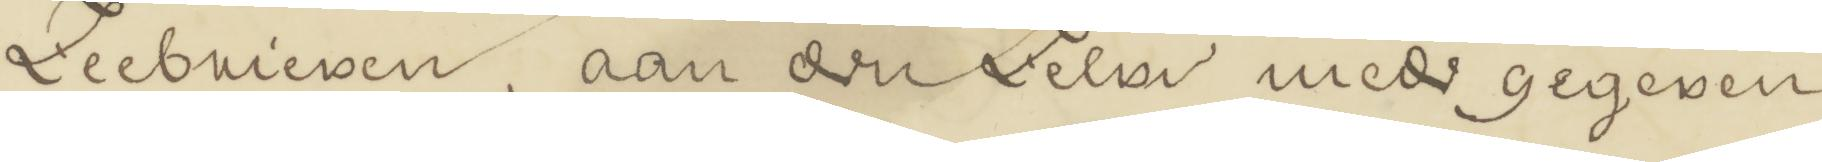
Zeebrieven, aan den selve mede gegeven,
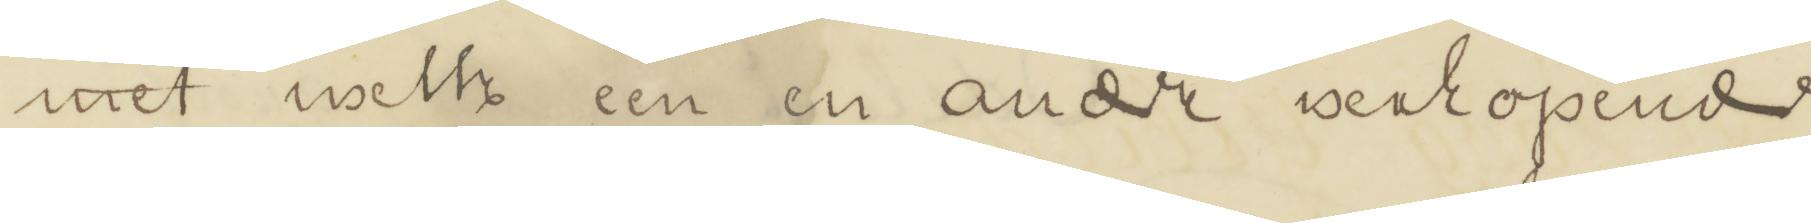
met welk een en ander verhopende
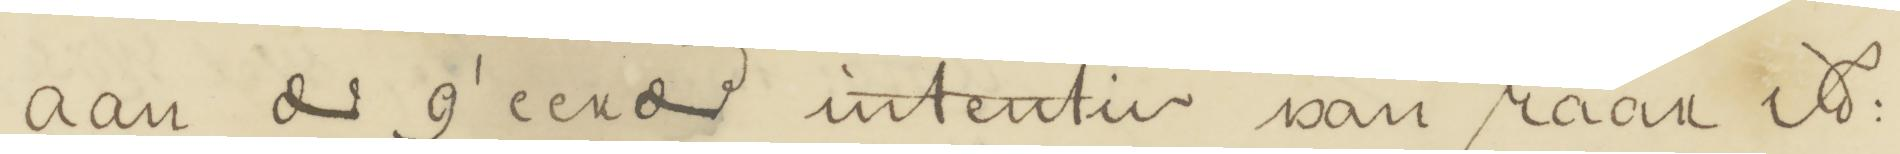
aan de g’eerde intentie van haar Ed:
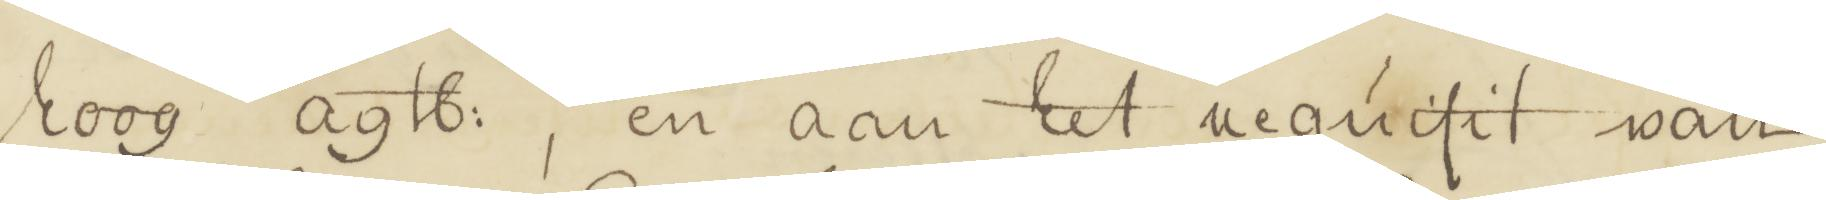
hoog agtb:, en aan het requisit van
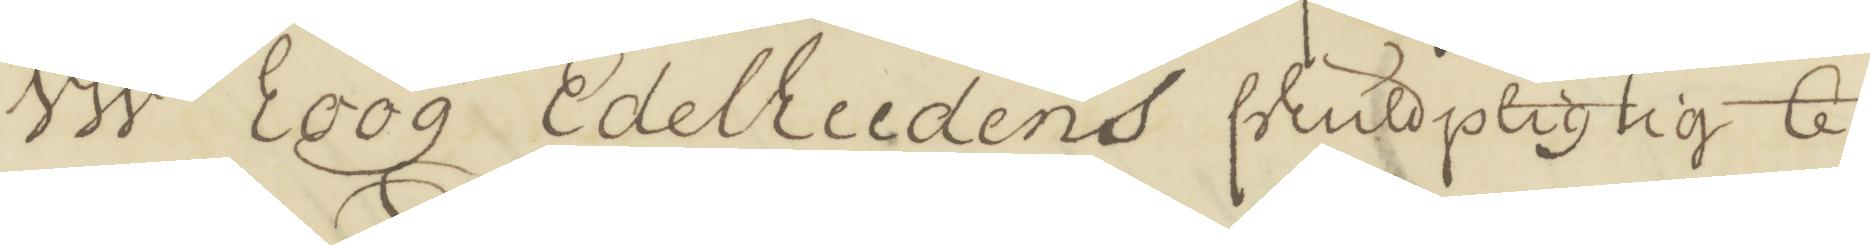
VW hoog Edelheedens schuldpligtig te
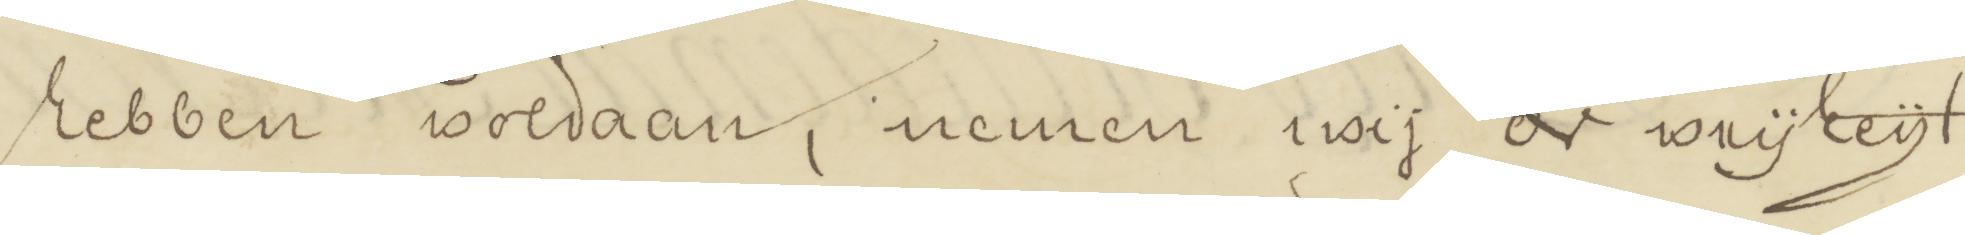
hebben voldaan, nemen wij de vrijheijt
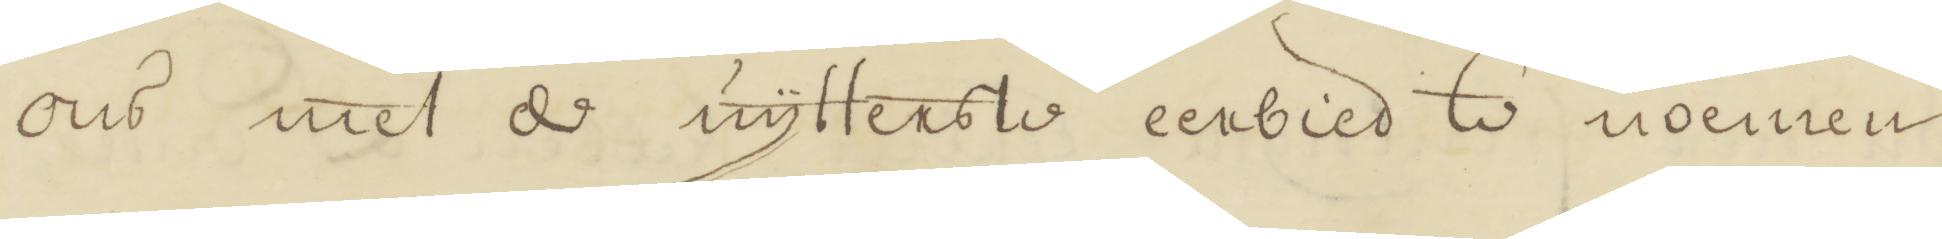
ons met de uijtterste eerbied te noemen
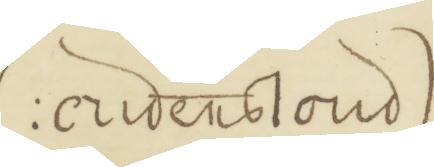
(:ondersond)
